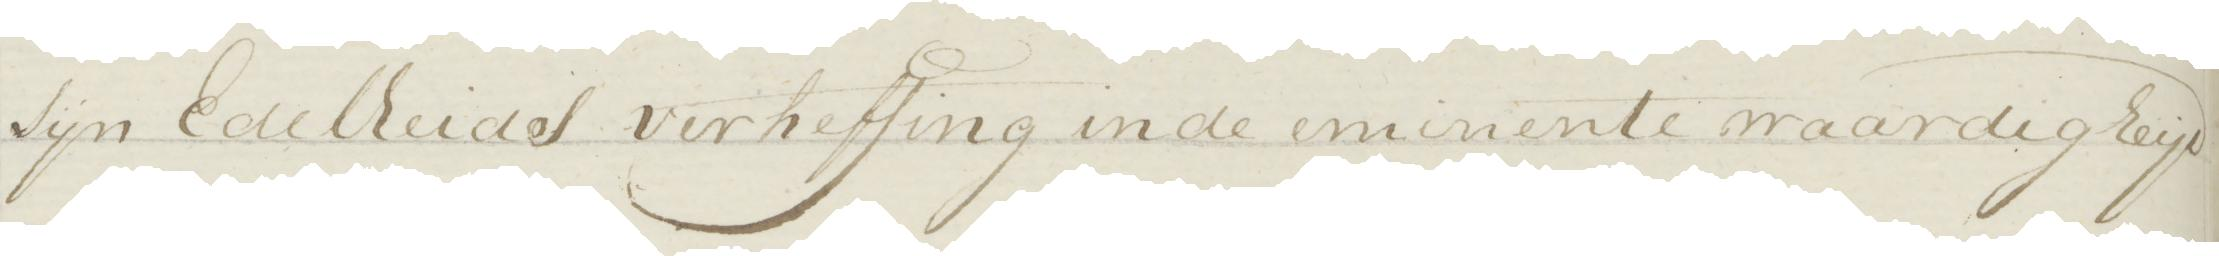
sijn Edelheids verheffing in de eminente waardigheijd
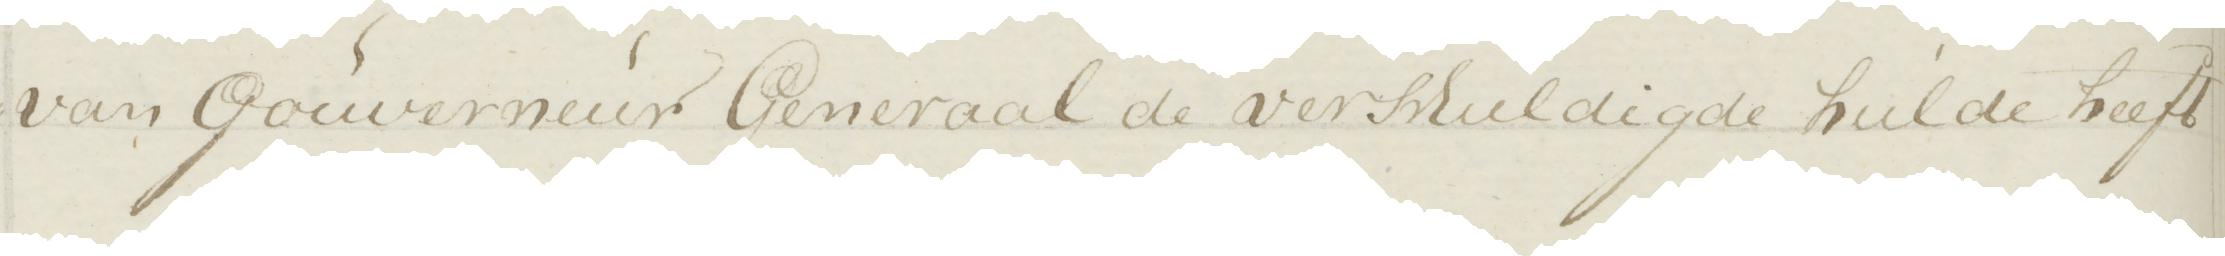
van Gouverneur Generaal de verschuldigde hulde heeft
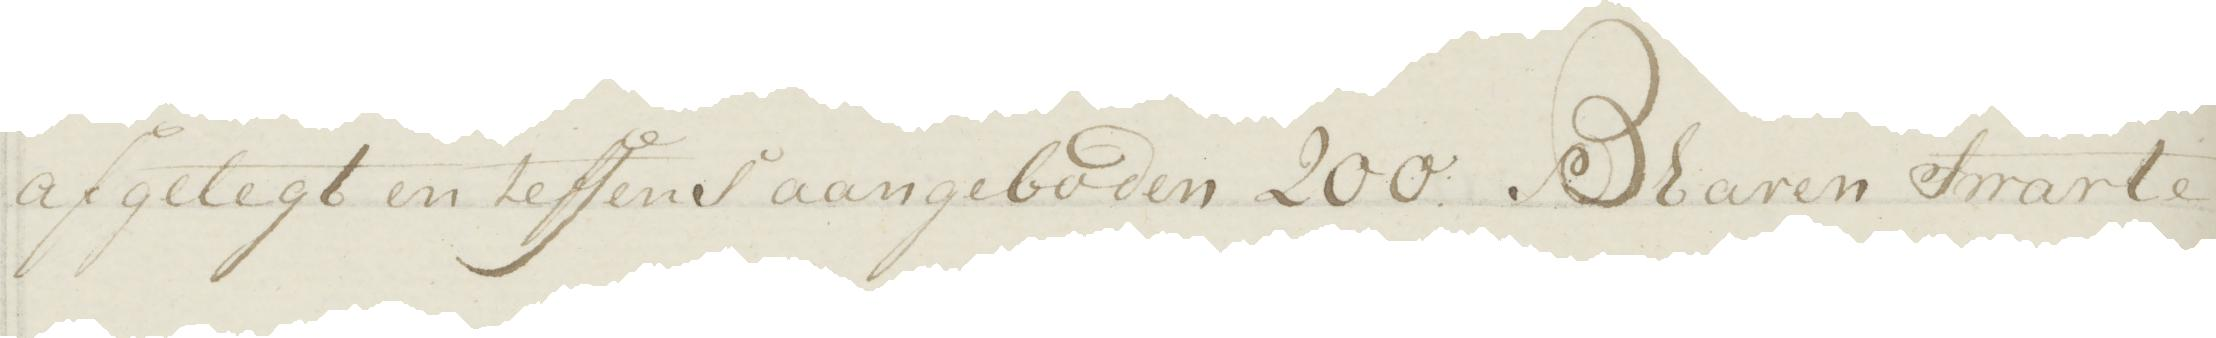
afgelegt en teffens aangeboden 200: Bharen Swarte
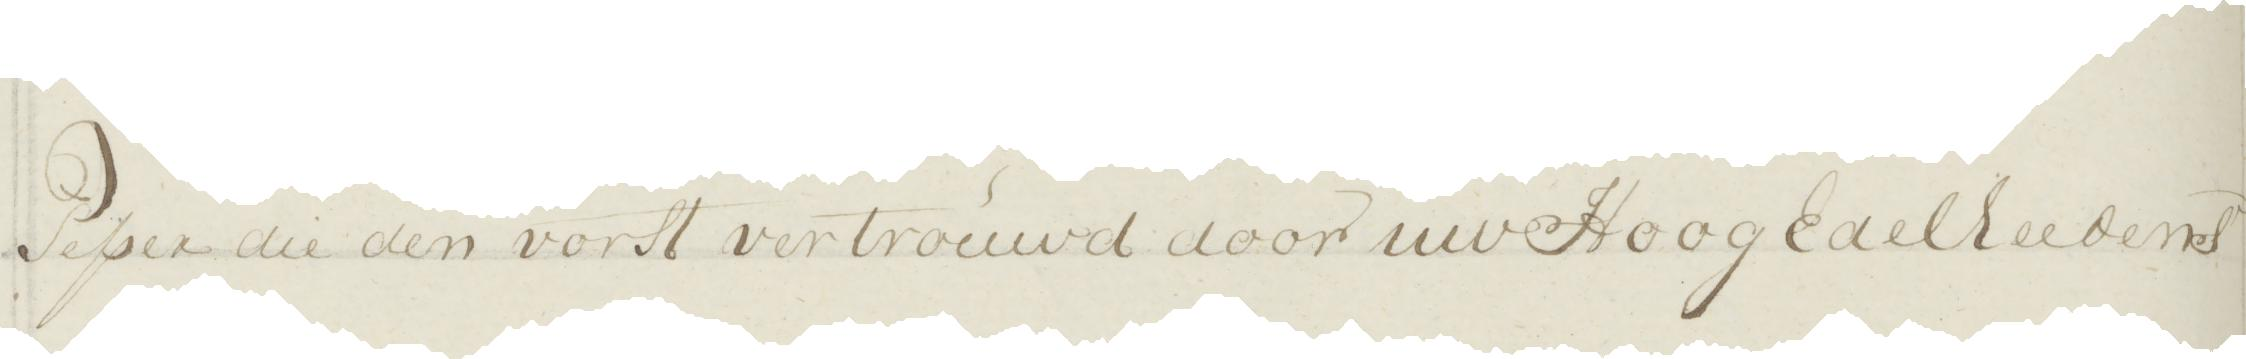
Peper die den vorst vertrouwd door uw Hoog Edelheedens
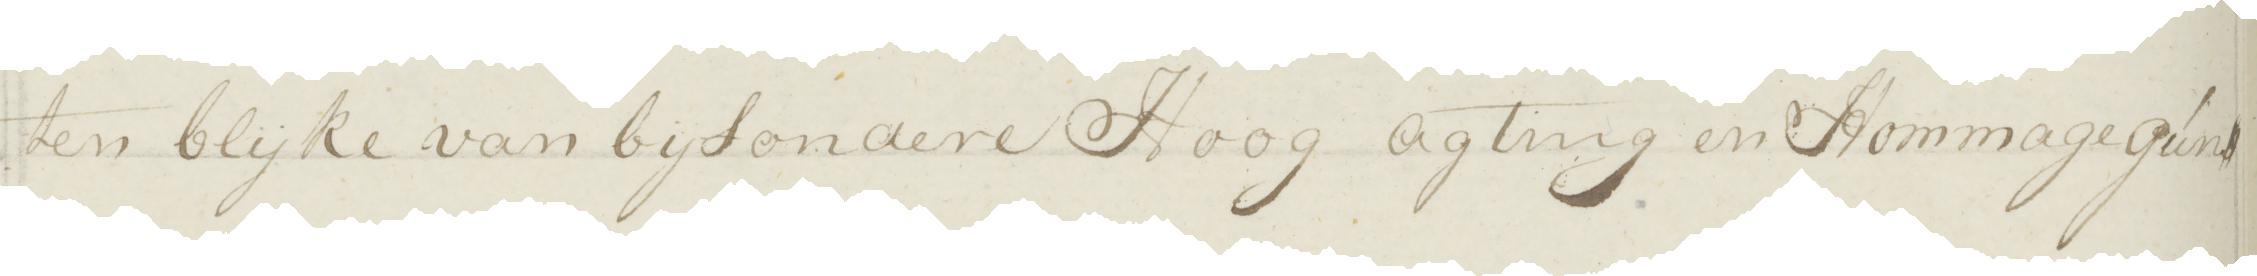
ten blijke van bijsondere Hoog agting en Hommage guns
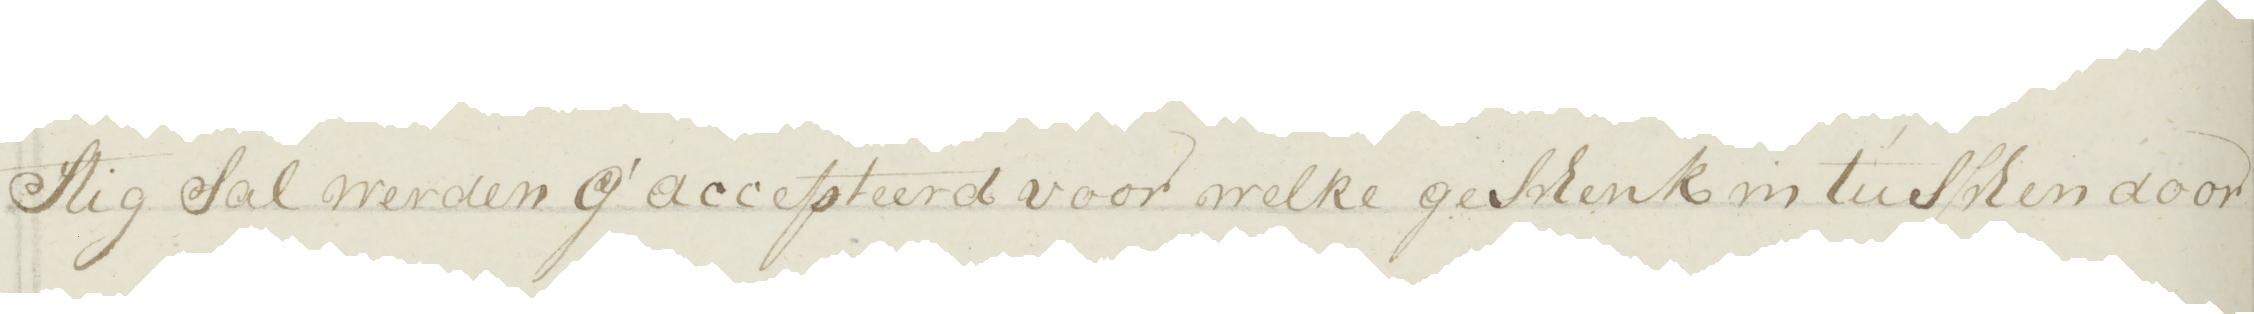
stig sal werden g’ accepteerd voor welke geschenk in tusschen door
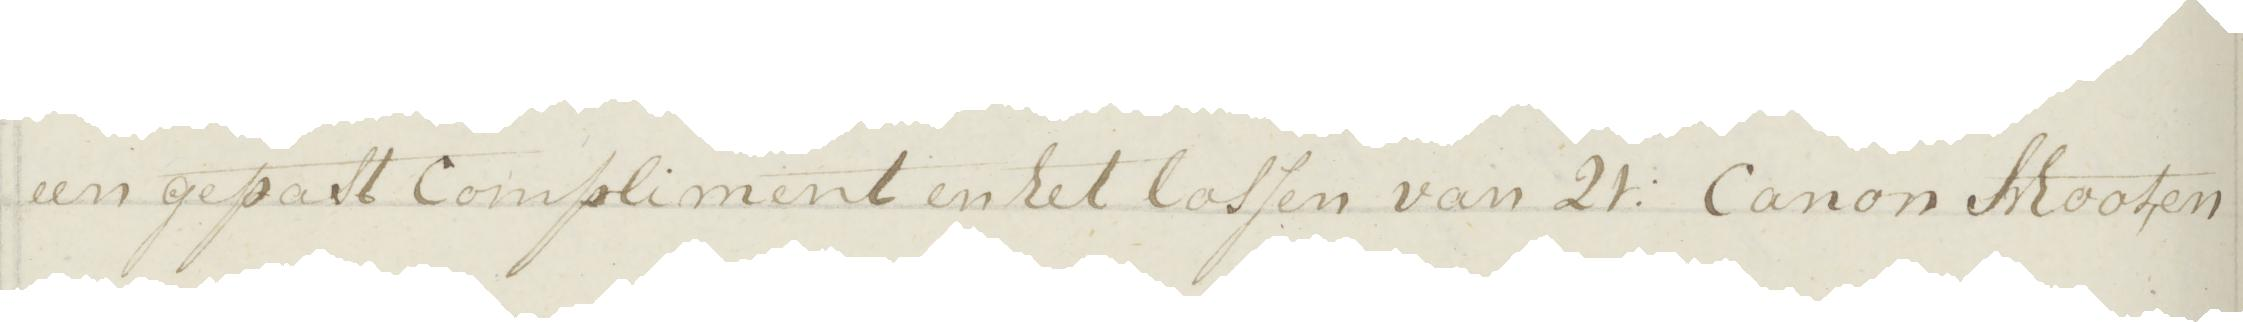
een gepast Compliment en het lossen van 21: Canon Schooten
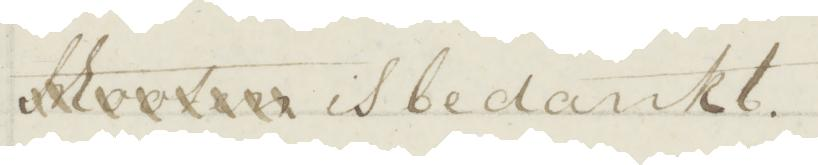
schooten is bedankt.
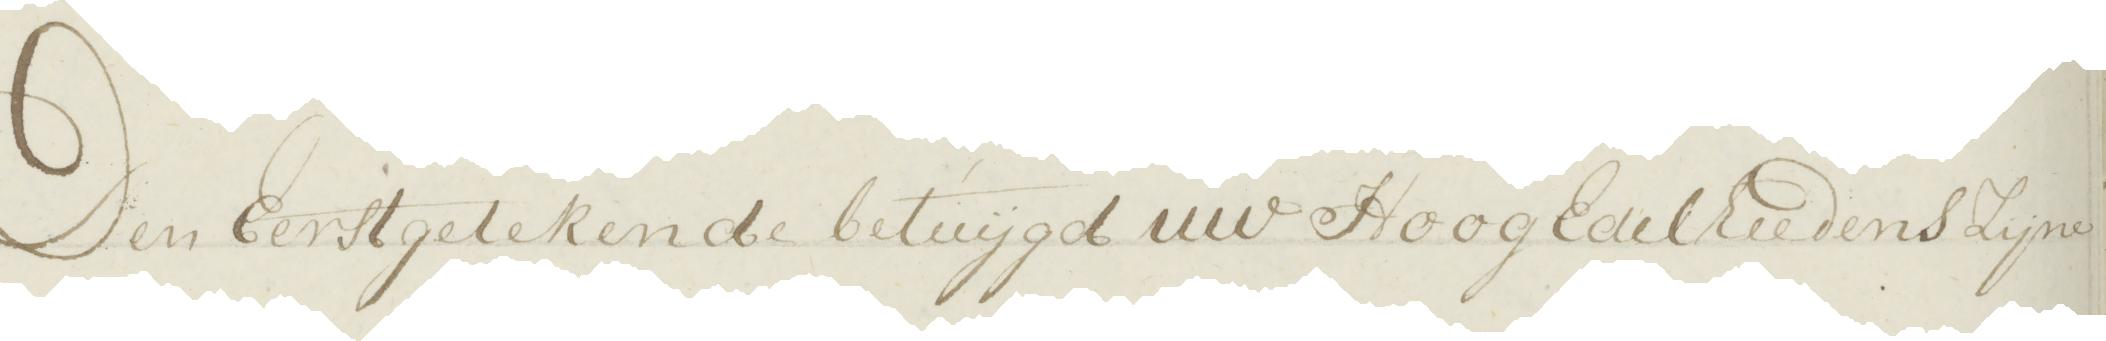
Den Eerstgetekende betuijgd uw Hoog Edelheedens zijne
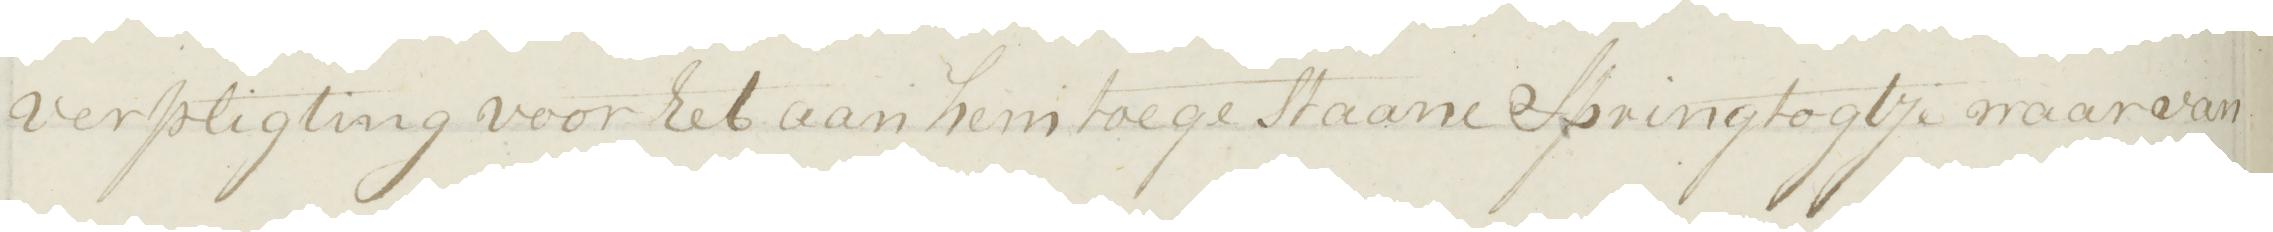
verpligting voor het aan hem toegestaane Springtogtje waarvan
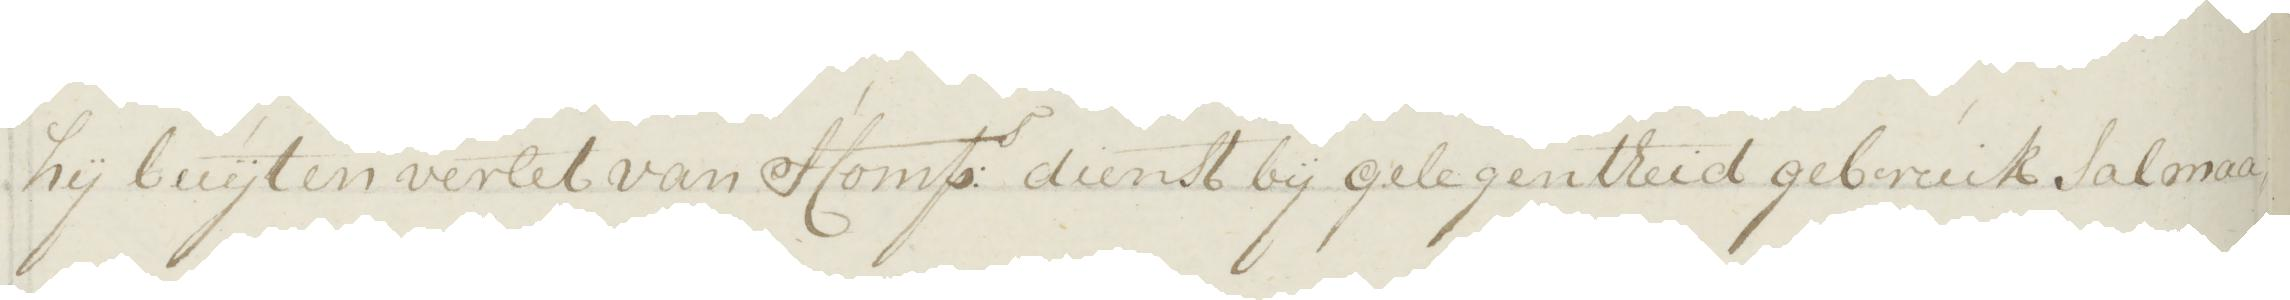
hij buijten verlet van S'Comp:s dienst bij gelegentheid gebruik sal maa„
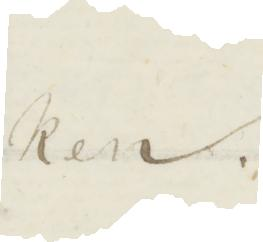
ken.
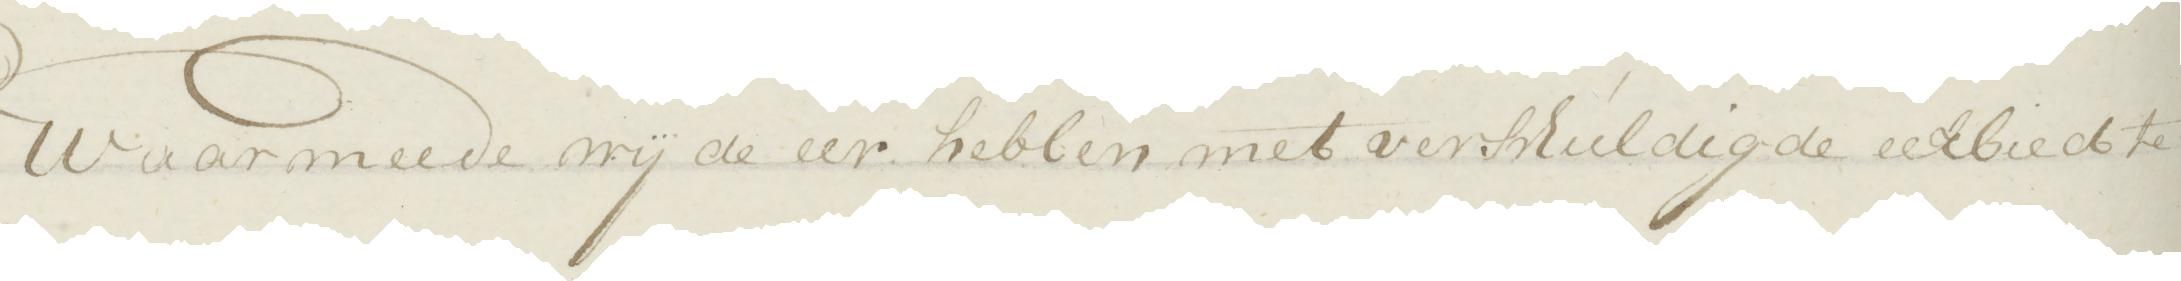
Waarmeede wij de eer hebben met verschuldigde eerbied te
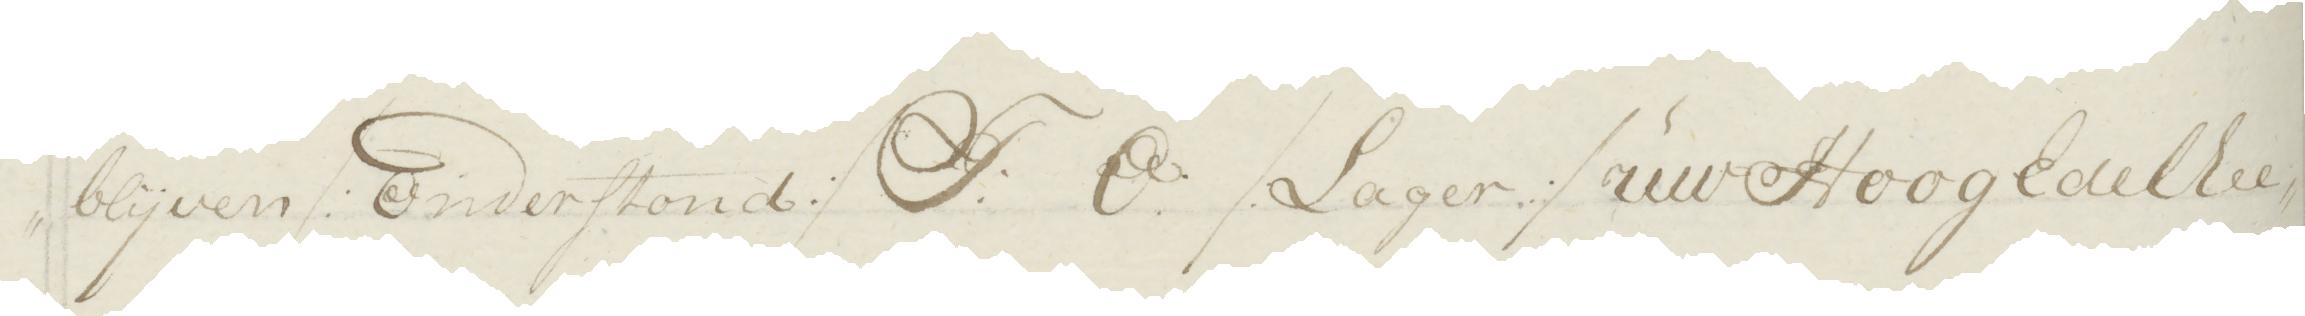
„ blijven /:Onderstond:/ T: O /:Lager:/ uw Hoog Edelhee„
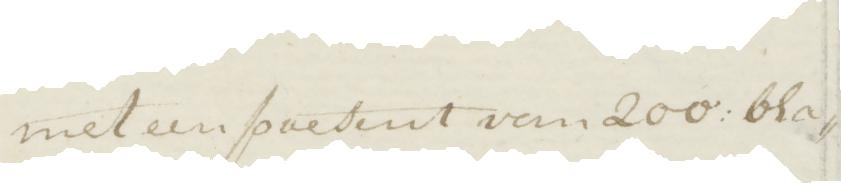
met een present van 200: bha„
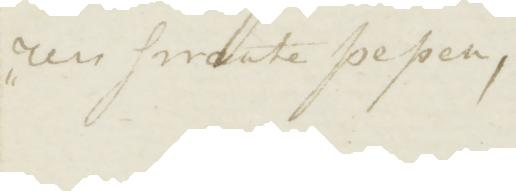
„ren swarte peper;
